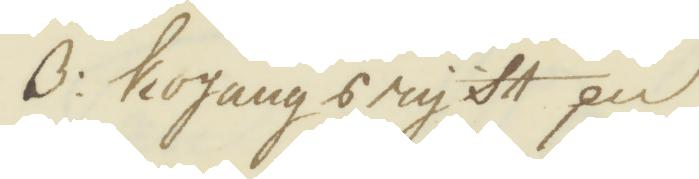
3: kojangs rijst en
